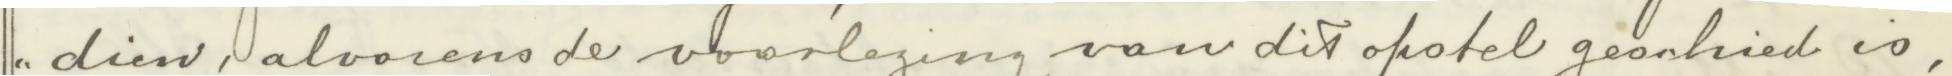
„dien,alvorens de voorlezing van dit opstel geschied is,
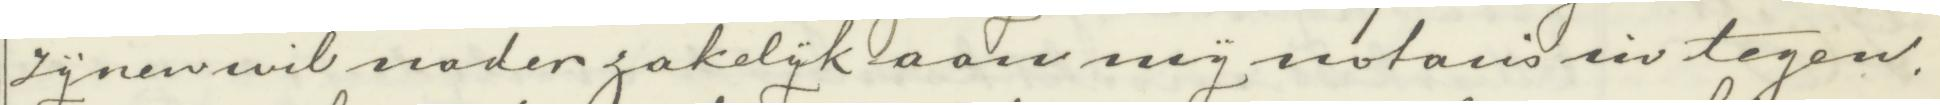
zijnen wil nader zakelijk aan mij notaris in tegen,
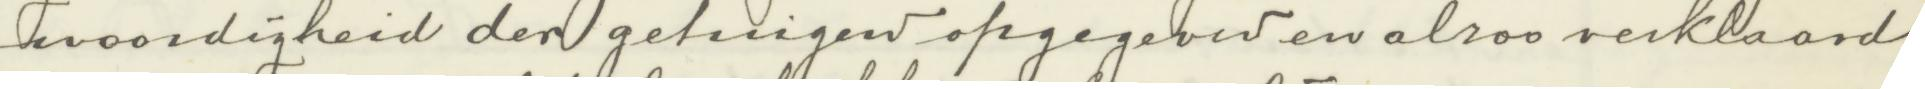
woordigheid der getuigen opgegeven en alzoo verklaard
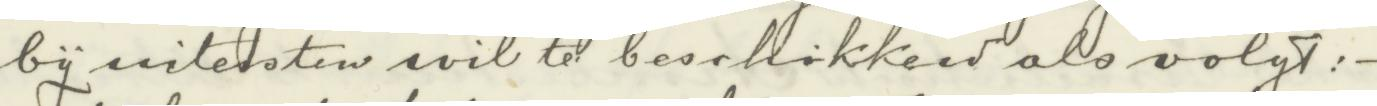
bij uitersten wil te beschikken als volgt:-
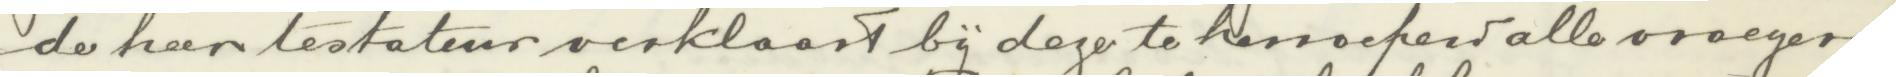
de heer testateur verklaart bij deze te herroepen alle vroegere
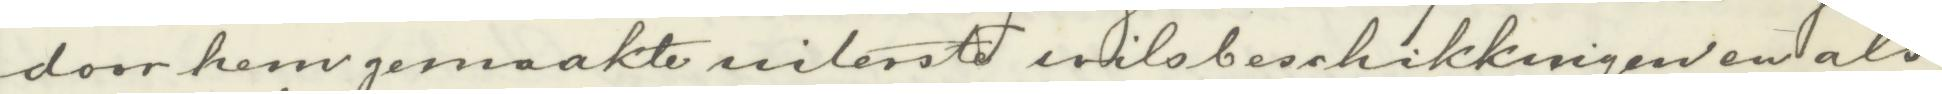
door hem gemaakte uiterste wilsbeschikkingen en als
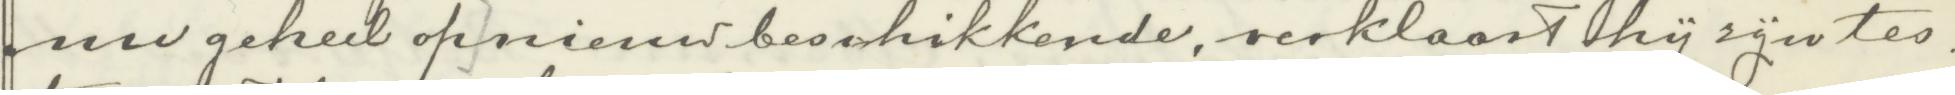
nu geheel opnieuw beschikkende, verklaart hij zijn tes
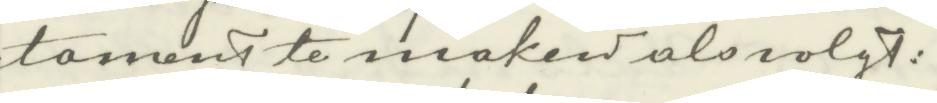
tament te maken als volgt:
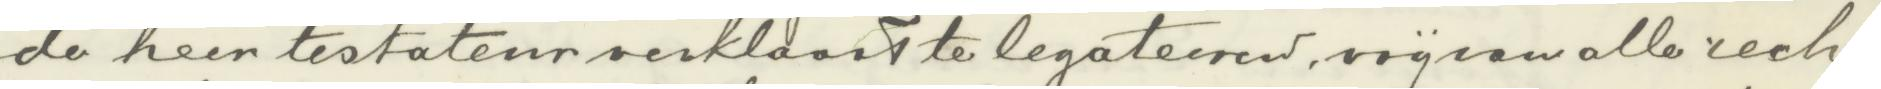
de heer testateur verklaard te legateeren, vrij van alle rech
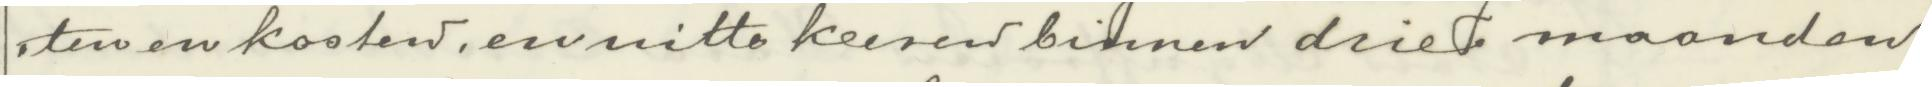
ten en kosten, en uitte keeren binnen drie maanden
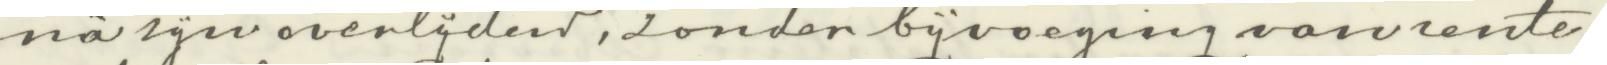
na zijn overlijden, zonder bijvoeging van rente
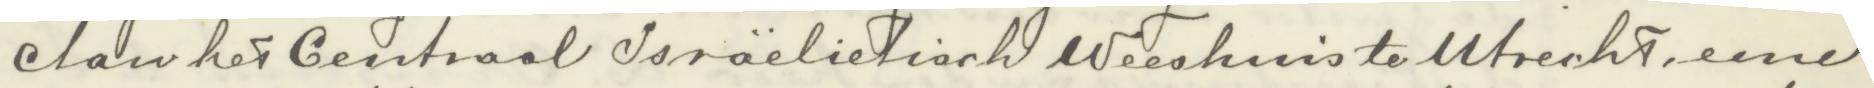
Aan het Centraal Israëlietisch Weeshuis te Utrecht, eene
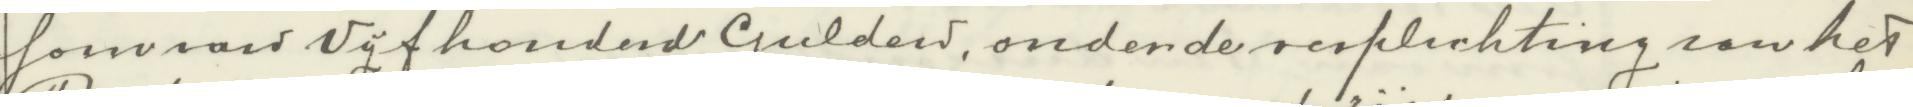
som van Vijf honderd Gulden, onder de verplichting van het
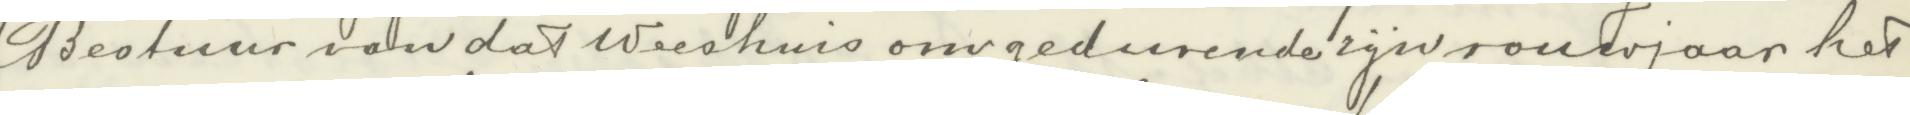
Bestuur van dat Weeshuis om gedurende zijn rouwjaar het
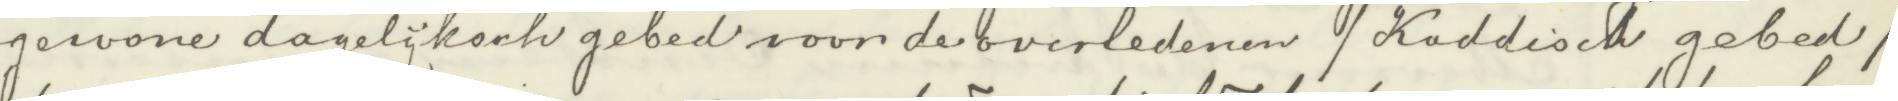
geroone dagelijksch gebed voor de overledenen /Kaddisch gebed/
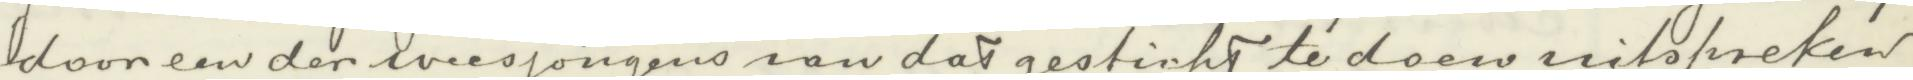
door een der weesjongens van dat gesticht te doen uitspreken
